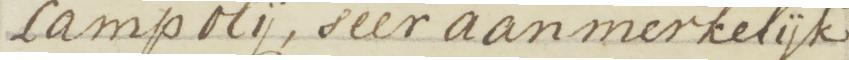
lampolij, seer aanmerkelijk
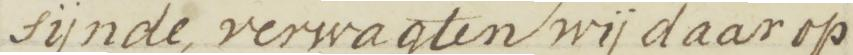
sijnde, verwagten wij daar op
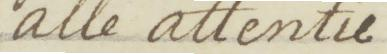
alle attentie
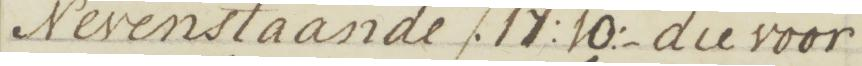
Nevenstaande ƒ17:10:– die voor
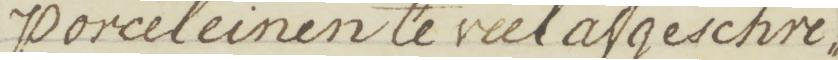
porceleinen te veel afgeschre„
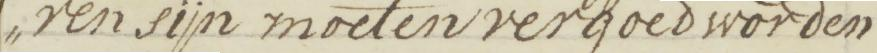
„ven sijn moeten vergoed worden
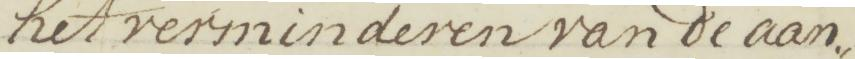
het verminderen van de aan„
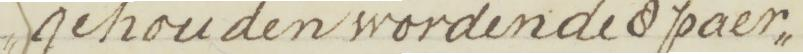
„gehouden worden de 8 paer„
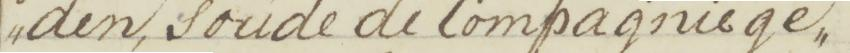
„den, soude de compagnie ge„
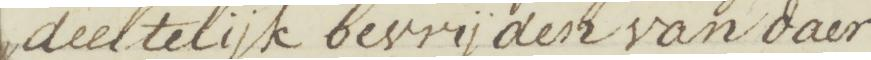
„deeltelijk bevrijden van daer
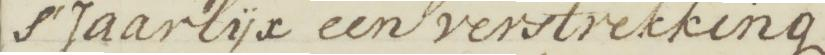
s'Jaarlijx een verstrekking
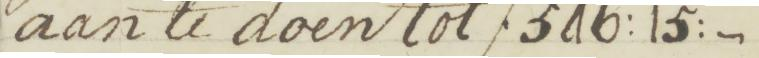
aan te doen tot ƒ546: 15: –
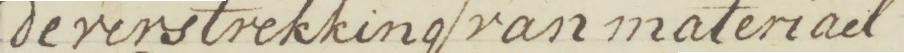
de verstrekking van materiael
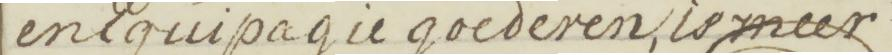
en Equipagie goederen, is meer
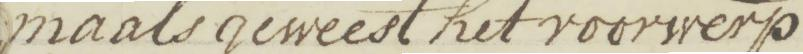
maals geweest het voorwerp
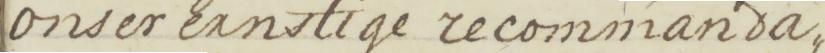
onser ernstige recommanda„
